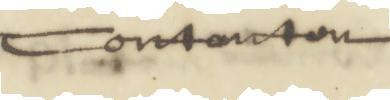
contanten
